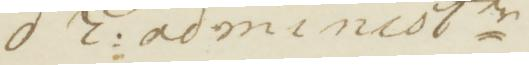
d E: administ=r
